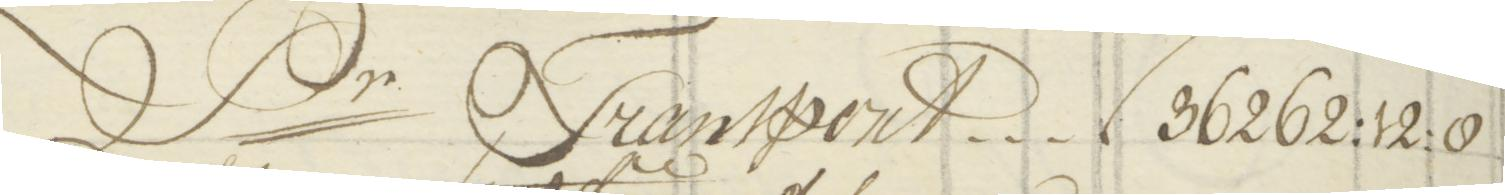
P=r Transport --- ƒ 36262:12:8
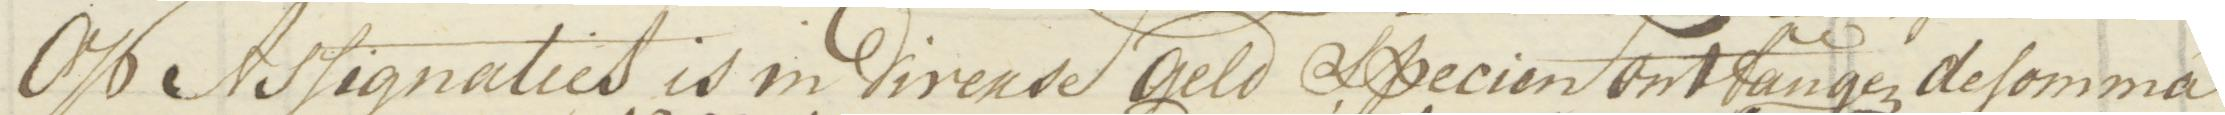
Op Assignaties is in diverse geld specien ontfangen de somma
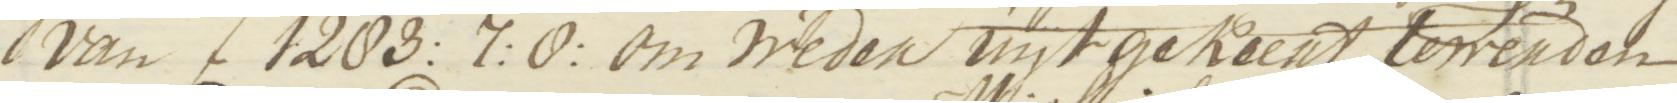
van ƒ 1283: 7: 8: om weder uijt gekeert te werden
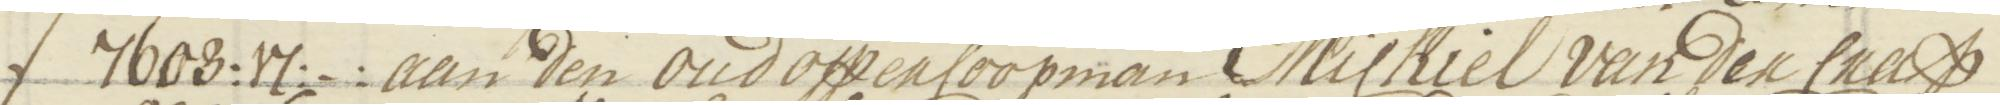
ƒ 7603.17:-: aan den oud oppercoopman Michiel van der Crap
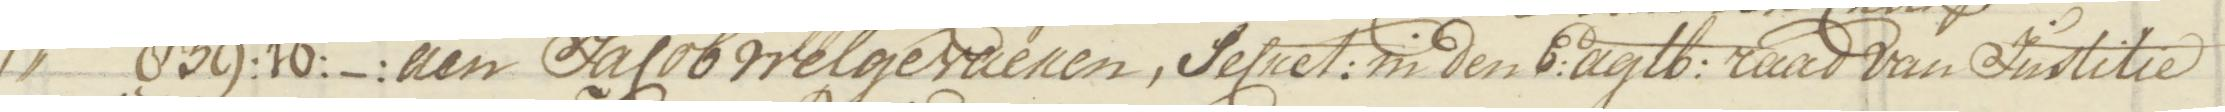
„ 839:16:—: aen Iacob welgevaeren, Secret: in den E: agtb: raad van Iustitie
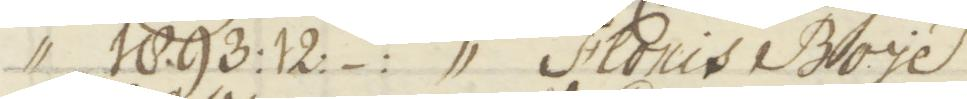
„ 18.93:12:-: „ Floris Boje
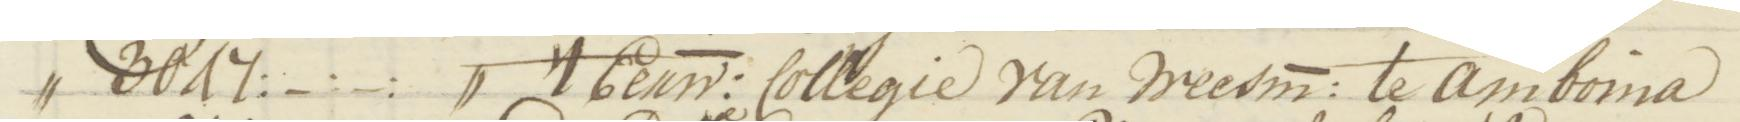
„ 3047:—:—: „ 't Eerw: Collegie van weesm: te Amboina
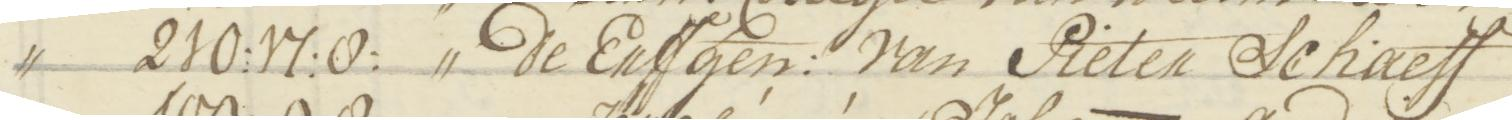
„ 210: 17: 8: „ de Erfgen: van Pieter Schaeff
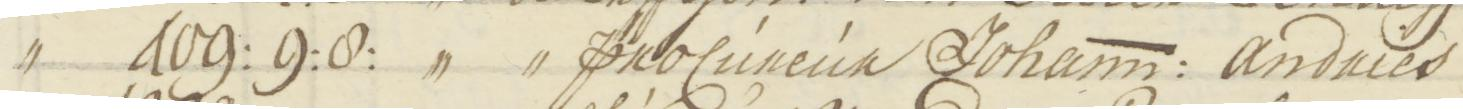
„ 409: 9: 8: „ „ procureur Iohann: Andries
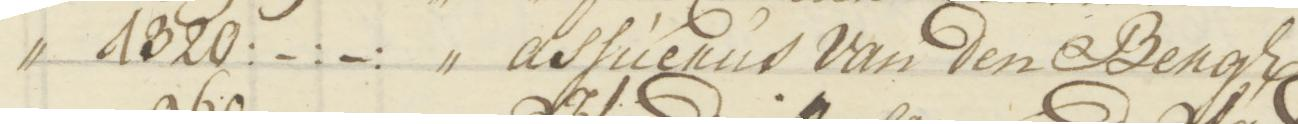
„ 4320:—:—: „ assuerus van den Bergh
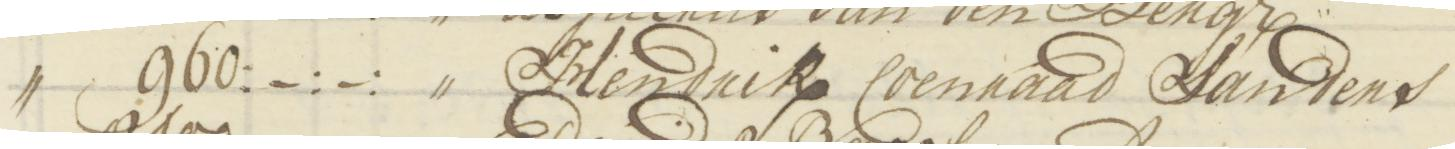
„ 960: —:—: „ Hendrik Coenraad Sanders
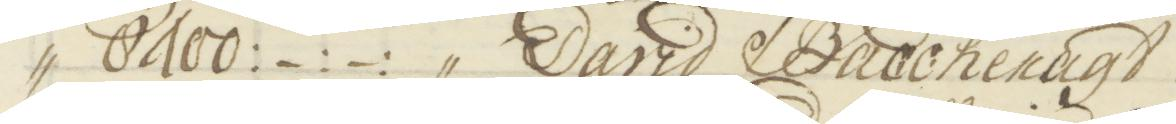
„ 8400:—:—: „ David Baccheragt
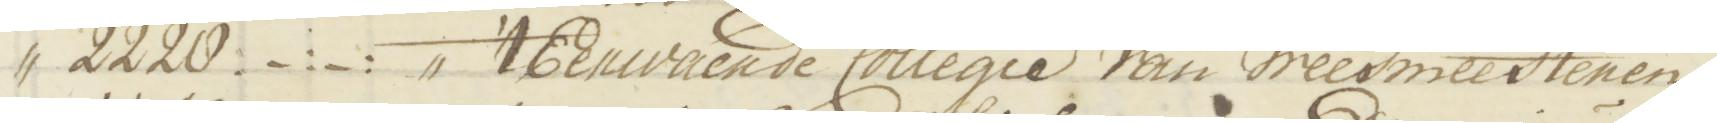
„ 2228: —: —: „ 't Eerwaerde Collegie van weesmeesteren
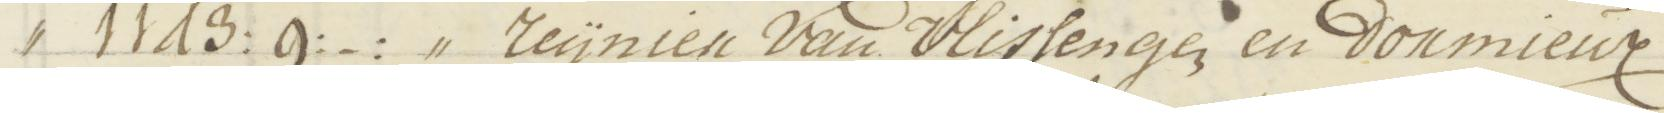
„ 1143: 9:—: „ reijnier van vlissengen en dormieux
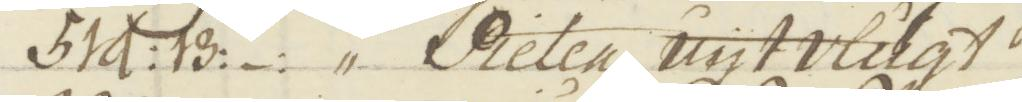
514: 13:—: „ Pieter uijtvlugt
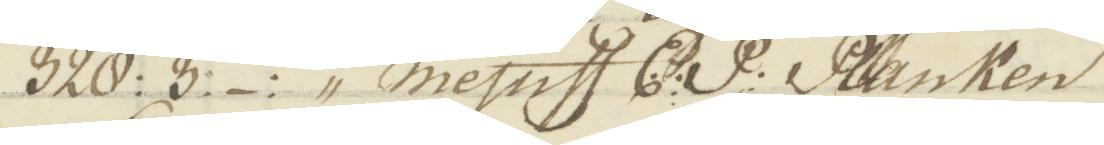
328: 3:—: „ mejuff E: P: Planken
